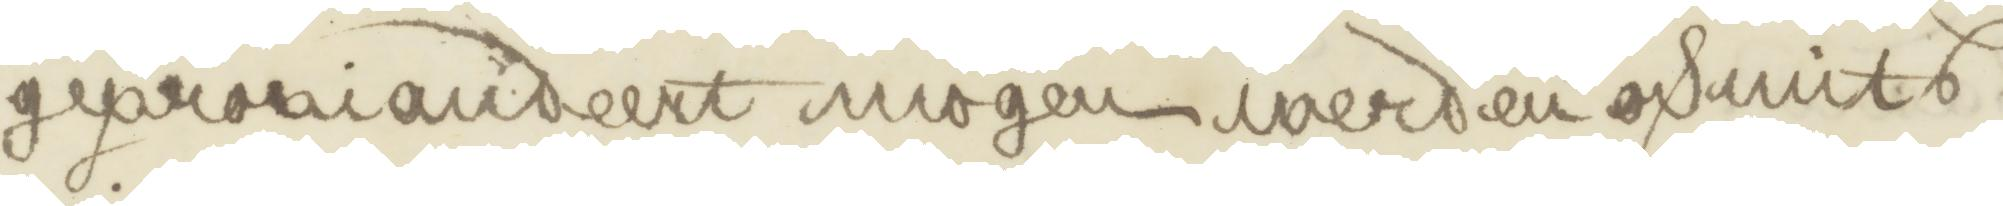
geproviandeert mogen werden overmits
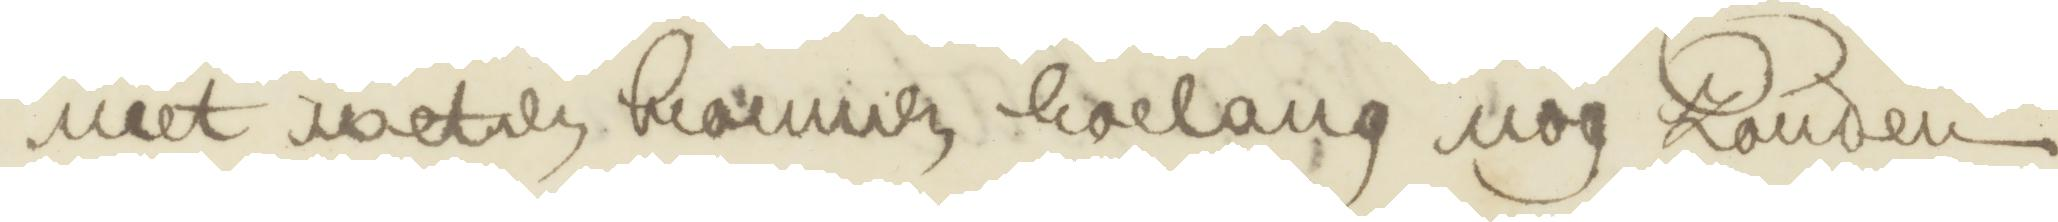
niet weten konnen hoelang nog zouden
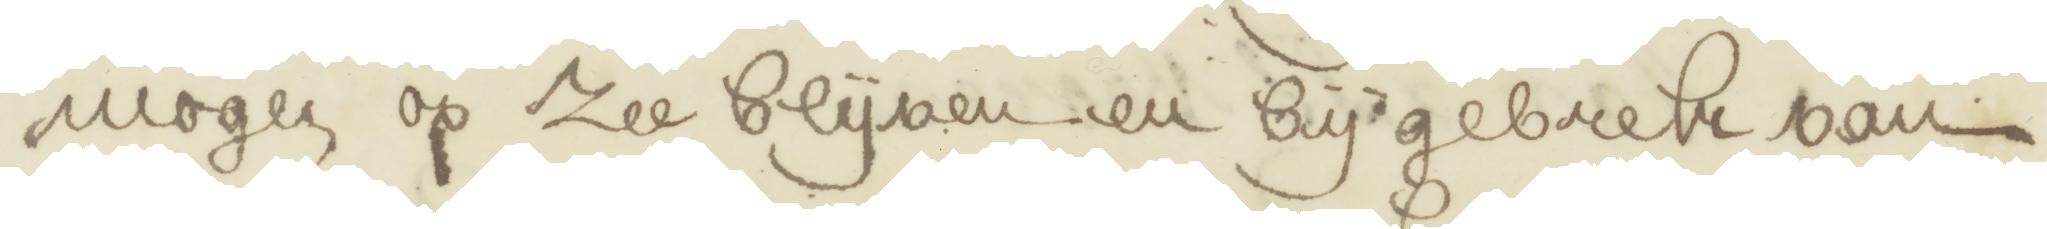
mogen op zee blijven en bij gebrek van
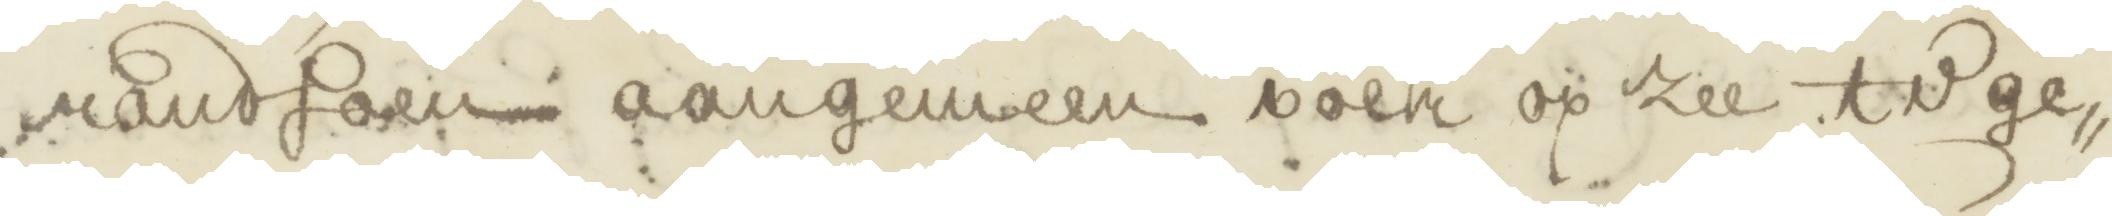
randsoen aangemeen volk op zee te ge„
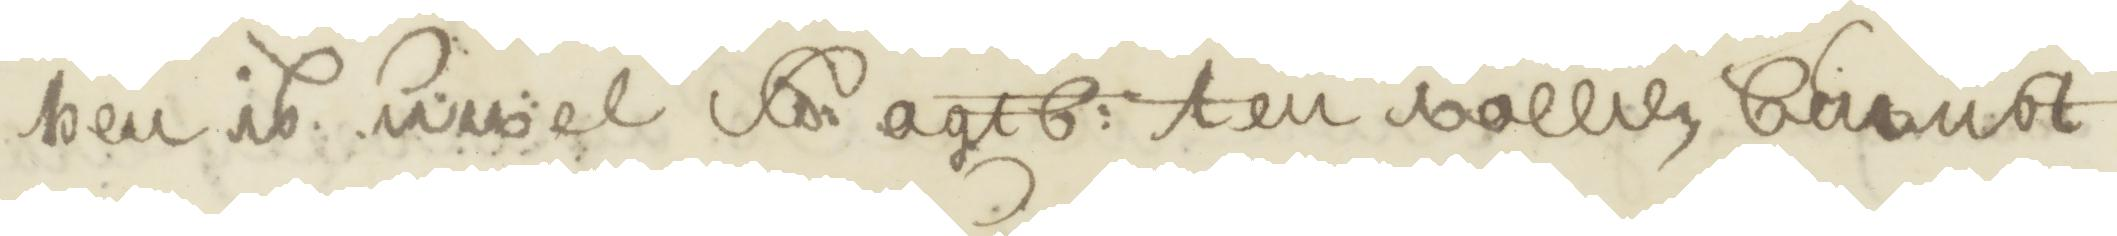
ven is uwel Ed: agtb: ten vollen bewust
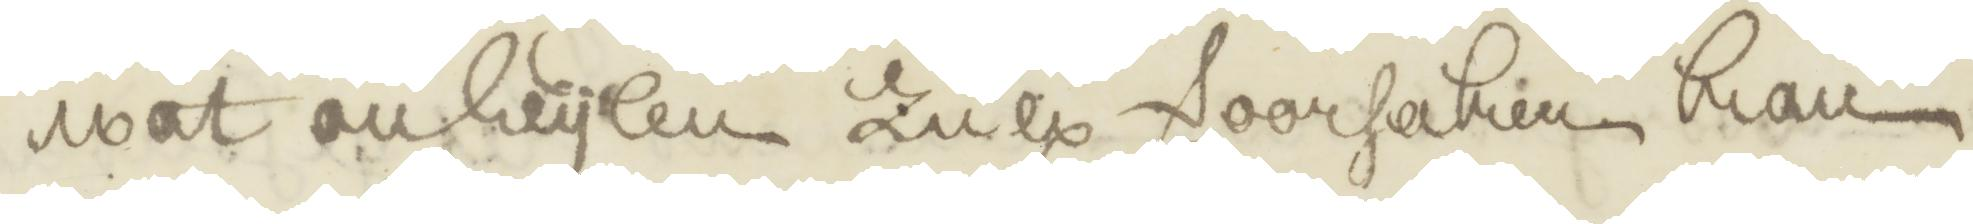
wat onheijlen zulx veroorsaken kan
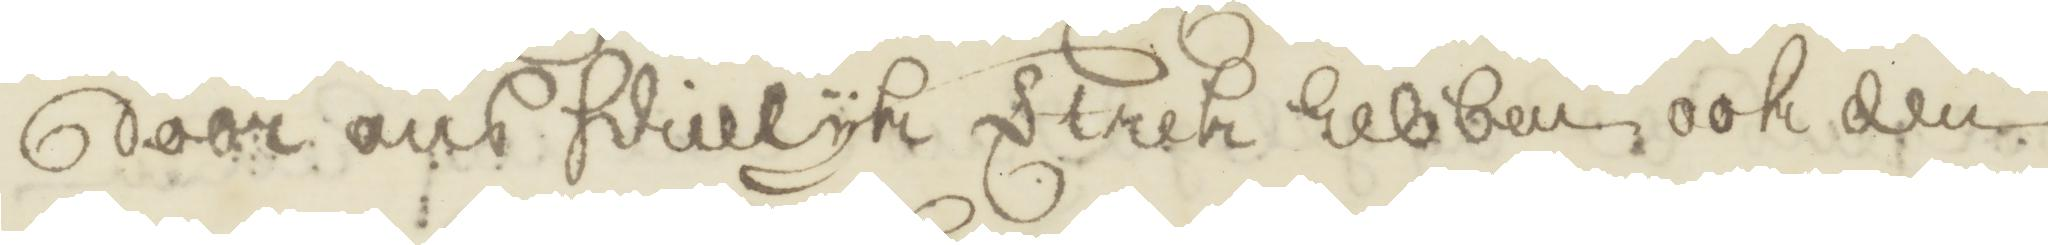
door ons schielijk vertrek hebben ook den
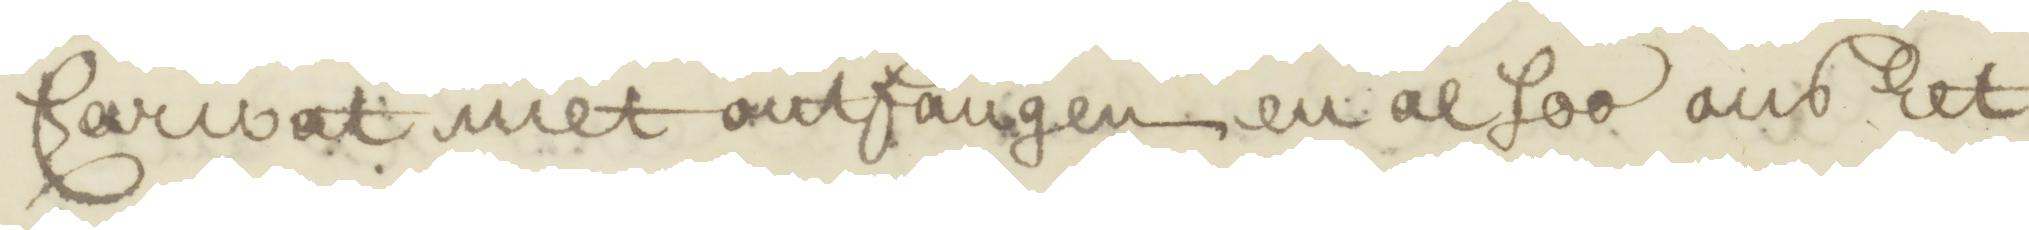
Carwat niet ontfangen en al soo ons het
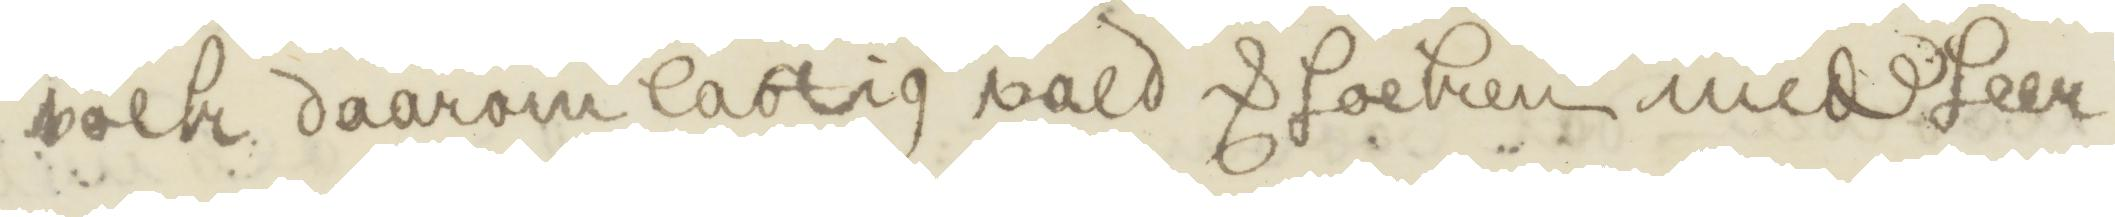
volk daarom lastig vald versoeken mede seer
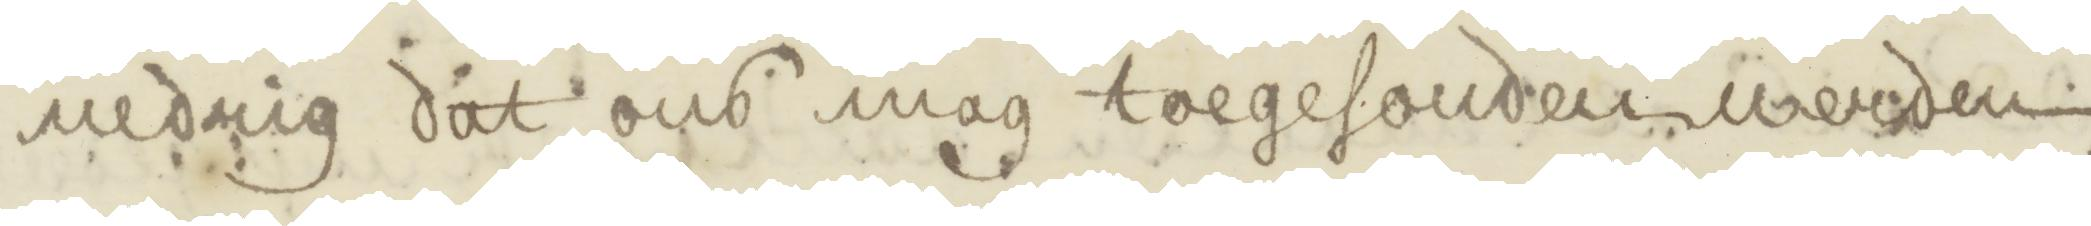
nedrig dat ons mag toe gesonden werden
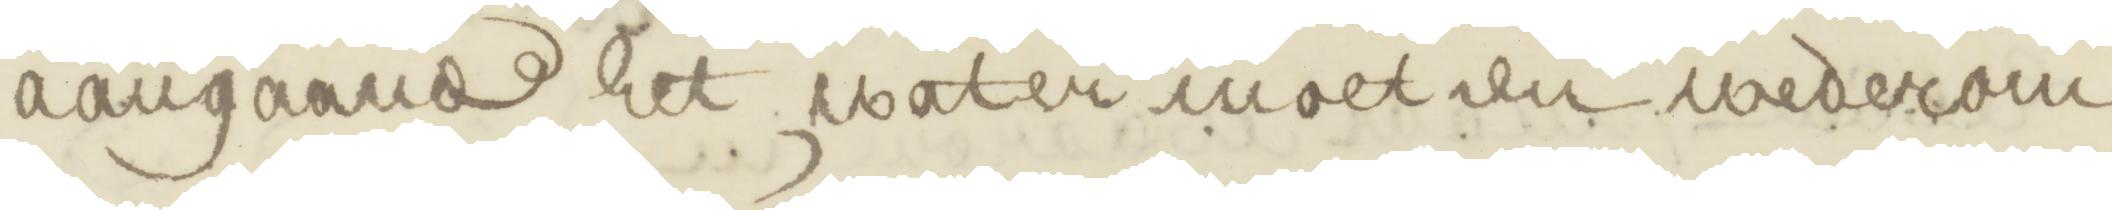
aangaande het water moeten wederom
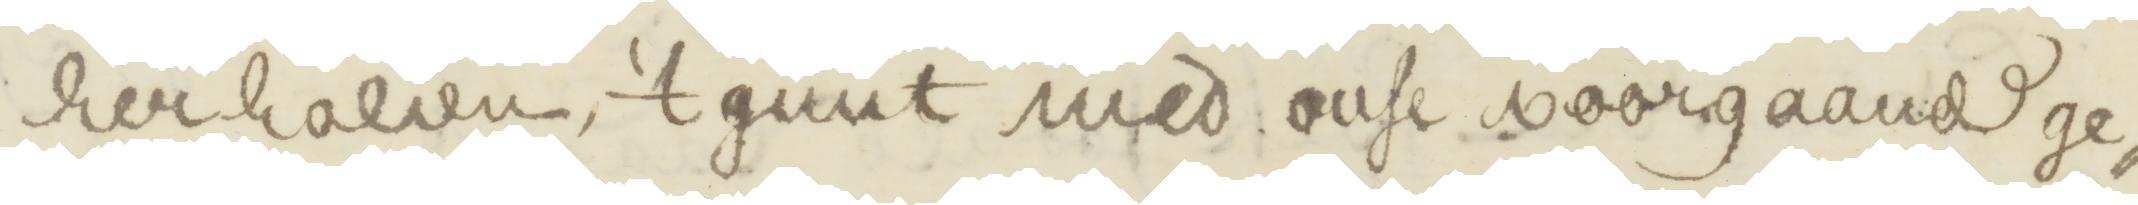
herhalen, 't gunt med onse voorgaande ge„
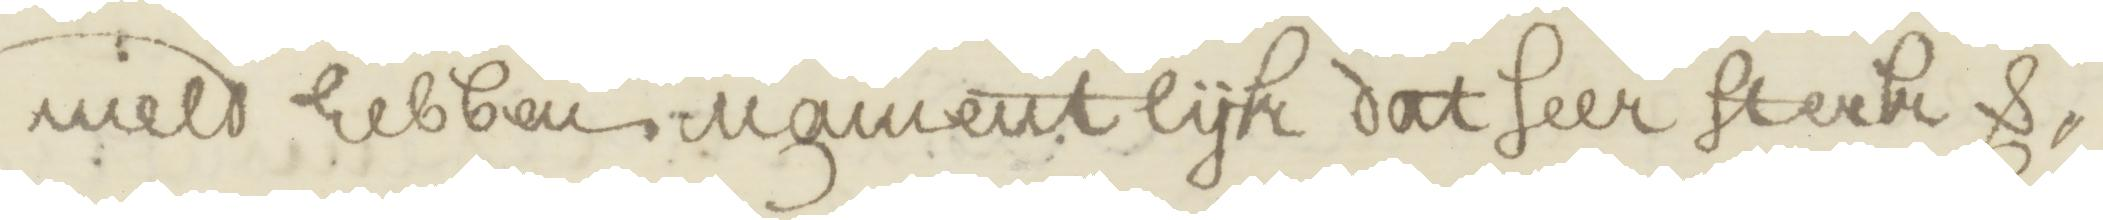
meld hebben namentlijk dat seer sterk ver„
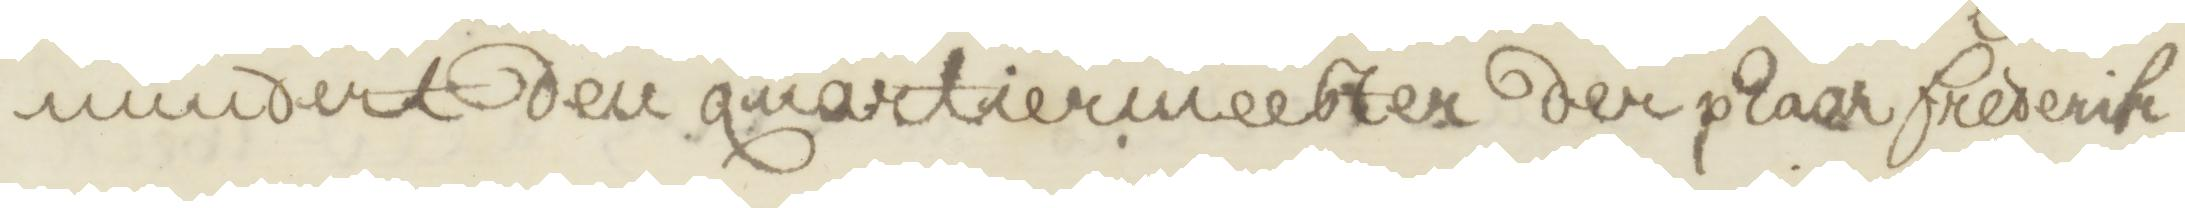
mindert den quartiermeester der phaar frederik
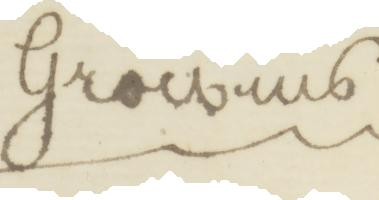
Growins
